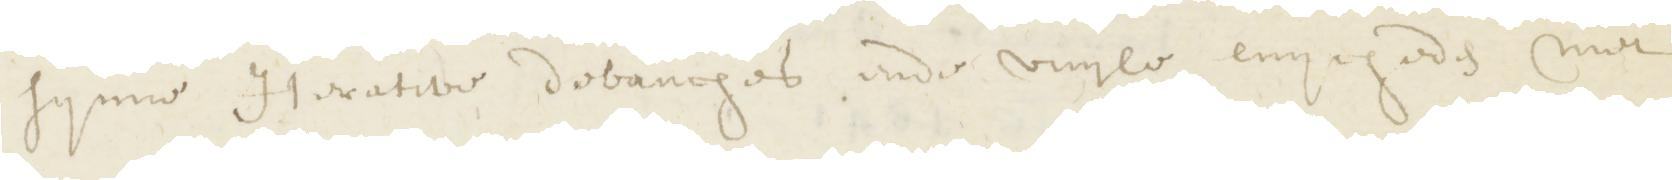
sijnne Iterative debauches ende vuyle luycheden met
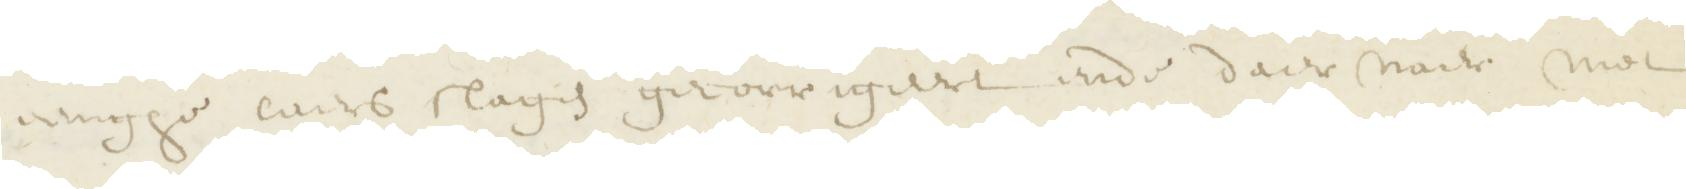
eenighe laers slagen gecorrigeert ende daer naer met
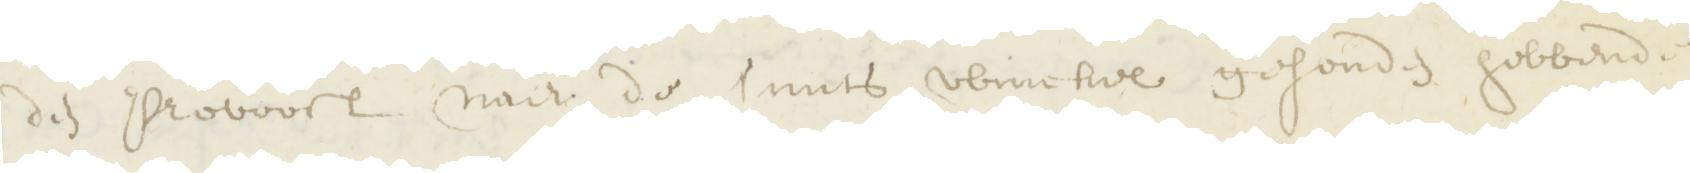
den prevoost maer de smits winckel gesonden hebbende
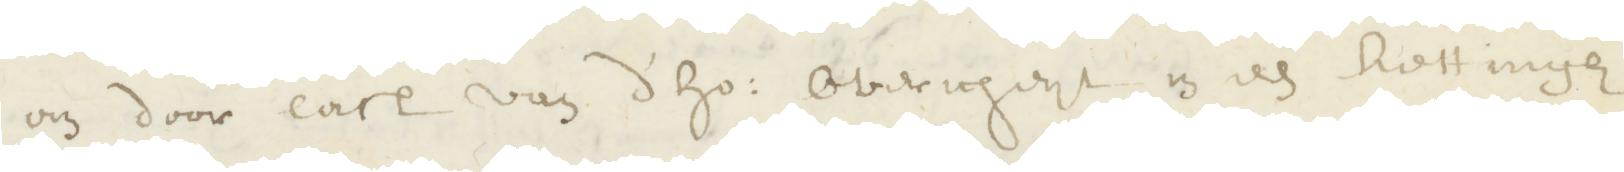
en door last van d’ Ho: overicheijt in een kettingen
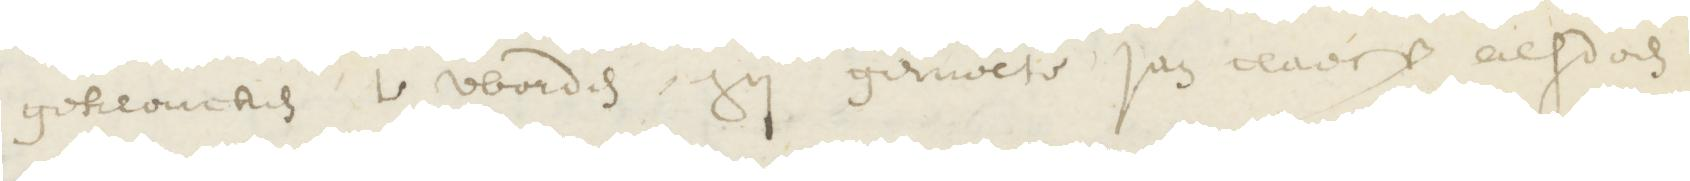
gekloncken te worden, hij gemelte Jan claesz alsdoen
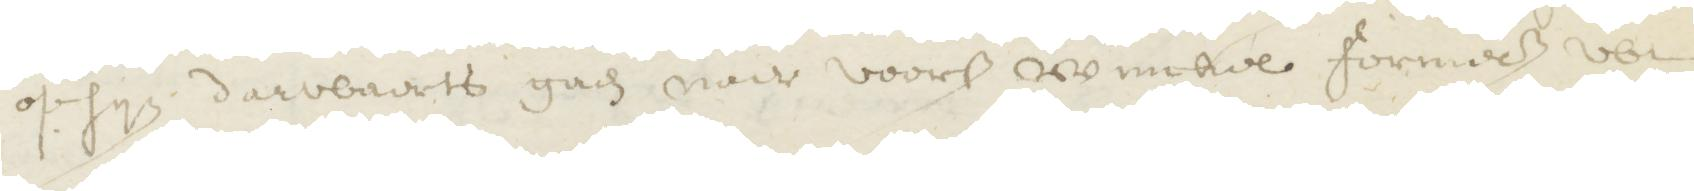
op syn darwaerts gaen naer voorsz winckel formelijk wel
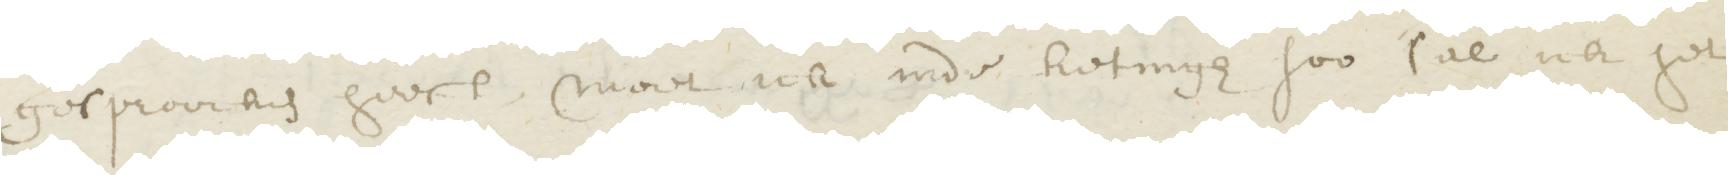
gesproocken heeft, moet ick inde ketingen soo sal ick het
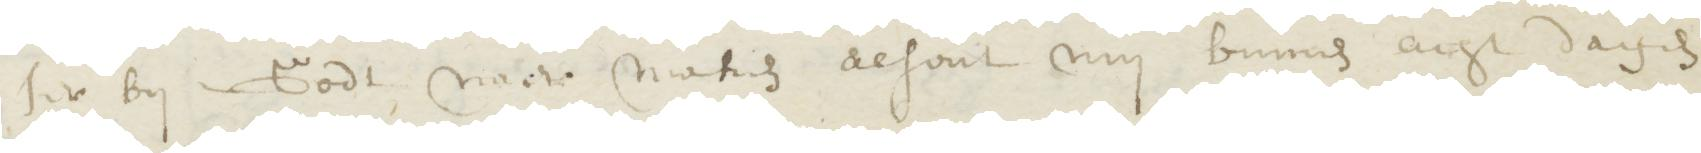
ser by Godt naer maten desent my binnen acht dagen
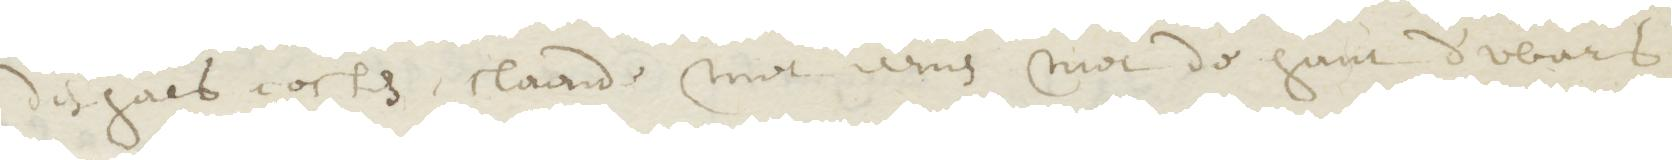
den hals costen, slaende met eenen met de hant dwars
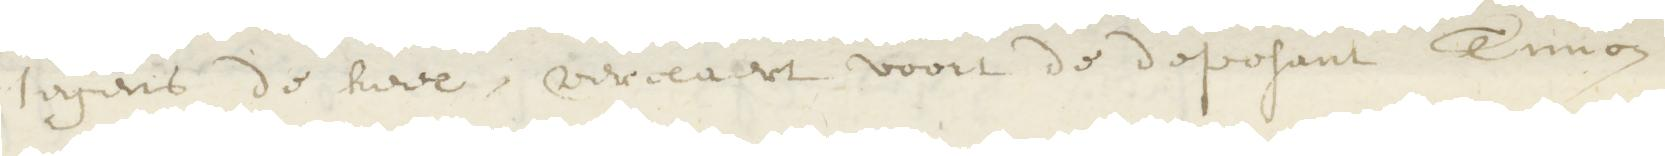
tegens de keel, verclaert voort de deposant Simon
